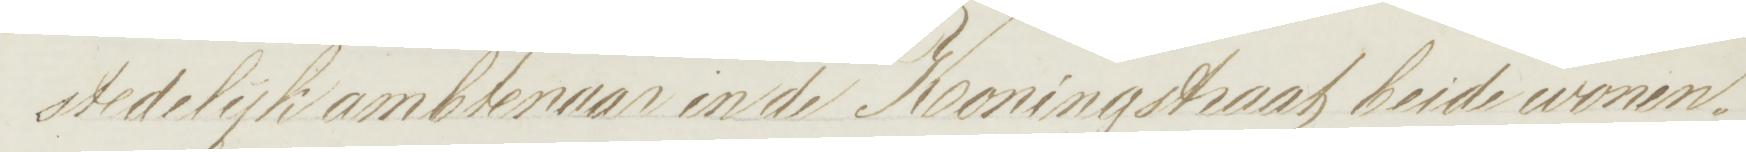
stedelijk ambtenaar in de Kooningstraat beide wonen„
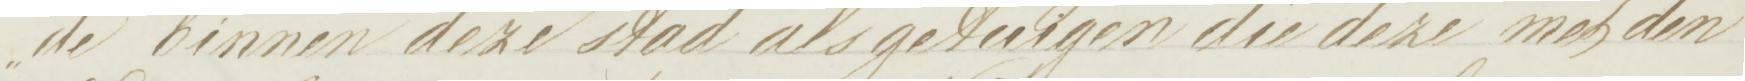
de binnen deze stad als getuigen die deze met den
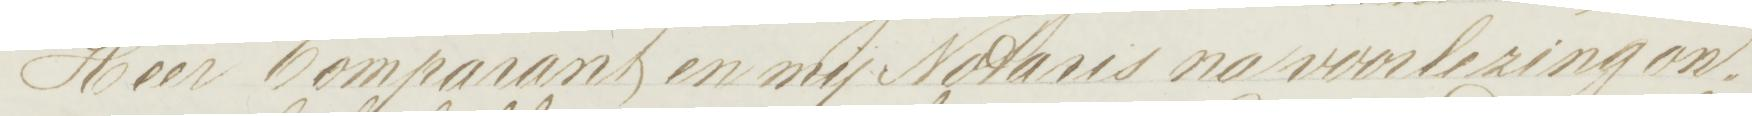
Heer Comparant en mij Notaris na voorlezing on„
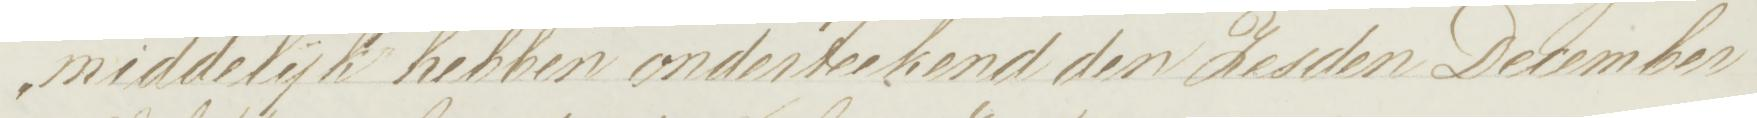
„middelijk hebben onderteekend den Zesden December
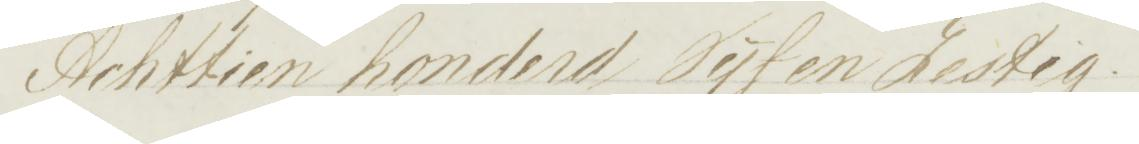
Achttien honderd Vyf en Zestig.
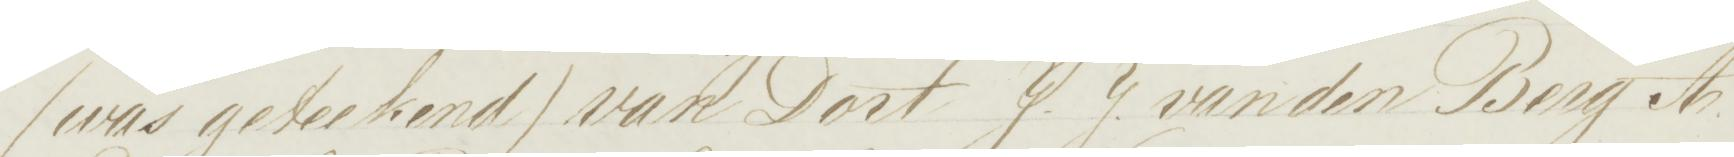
/was geteekend/ van Dort J. J. van den Berg A
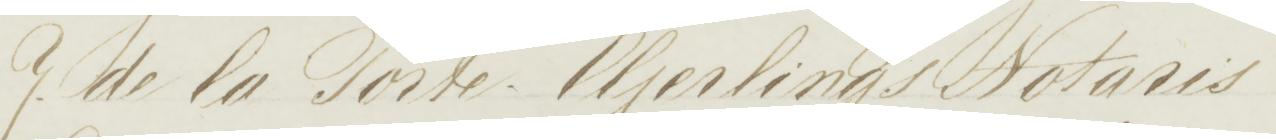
de la Porte. C Gerlings Notaris
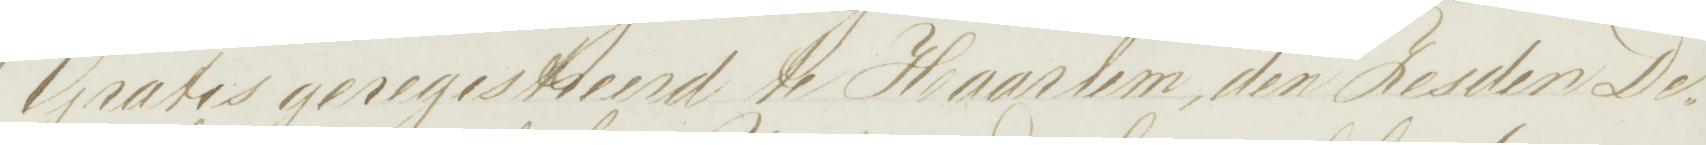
Gratis geregistreerd te Haarlem, den Zesden De„
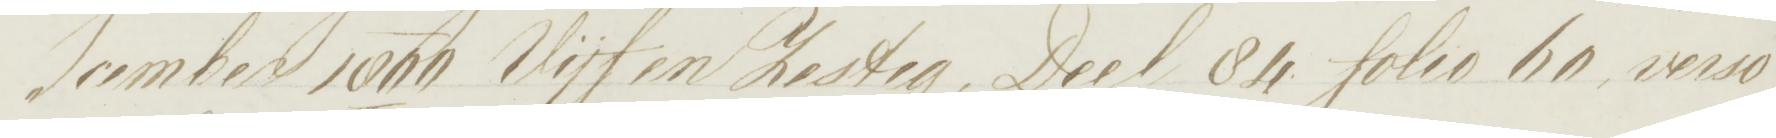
cember 1800 Vijf en Zestig, Deel 84: folio 60, verso
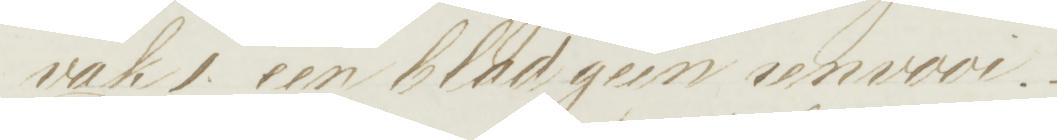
vak 1. een bladmgeen renvooi.
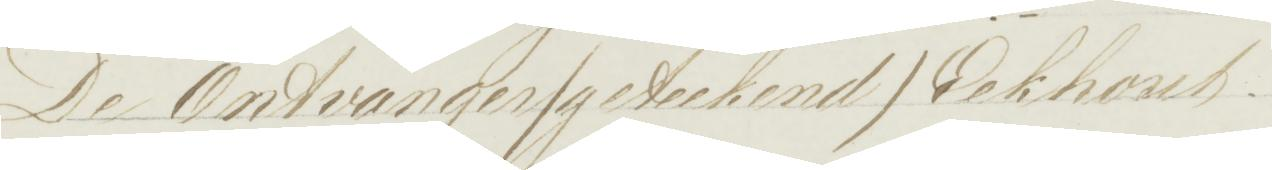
De Ontvanger (geteekend) Eekhout.
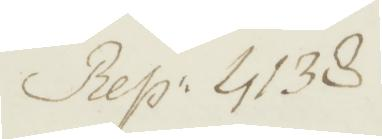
Rep: 4138
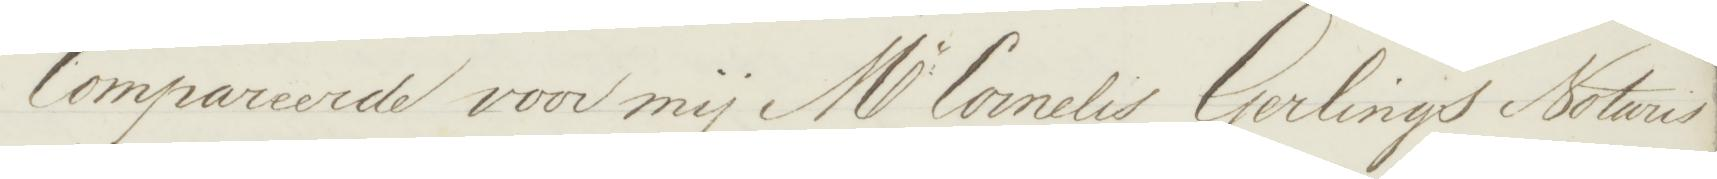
Compareerde voor mij M:r Cornelis Gerlings Notaris
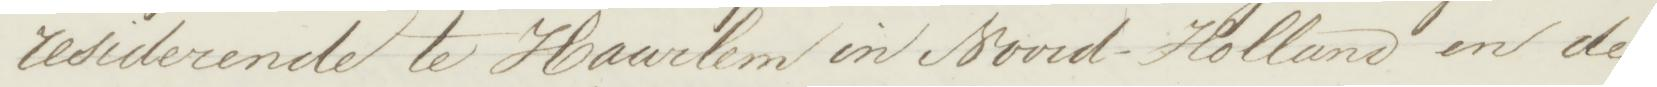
residerende te Haarlem in Noord-Holland in de
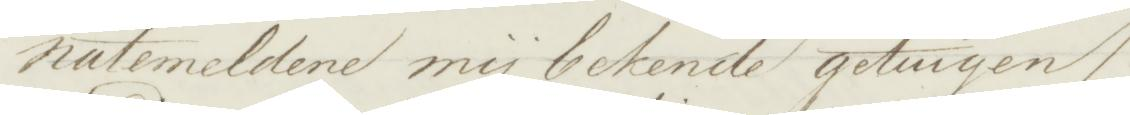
natemeldene mij bekende getuigen.
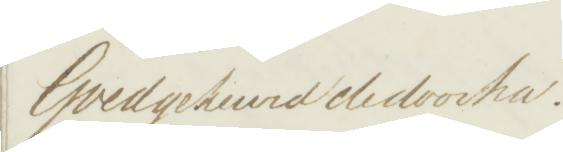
Goedgekeurd de doorha„
